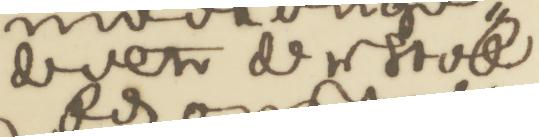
deelte der stof
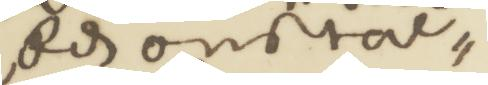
fen ons toe„
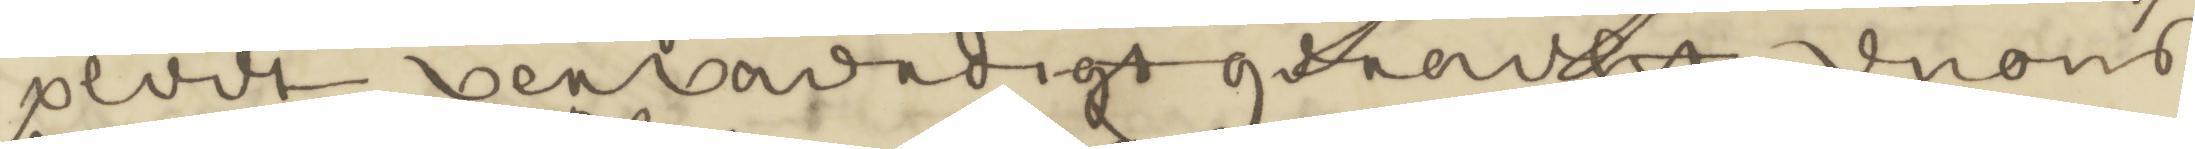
pleet vervaerdigt geraekt, en ons
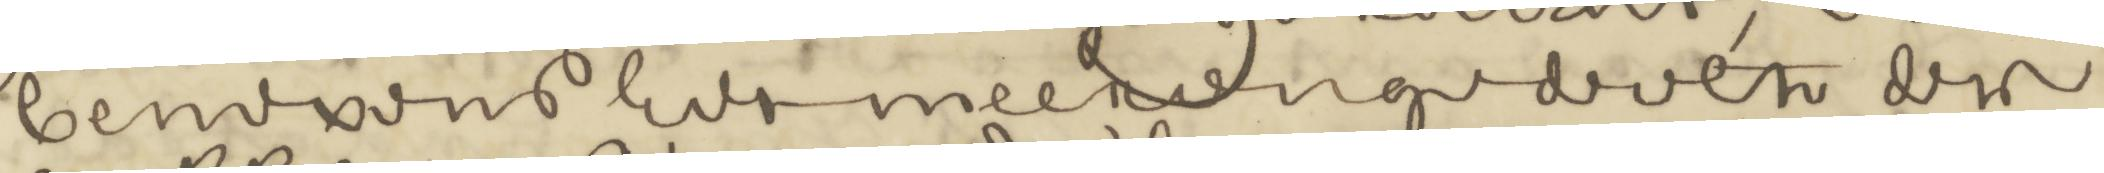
benevens het meerengedeelte der
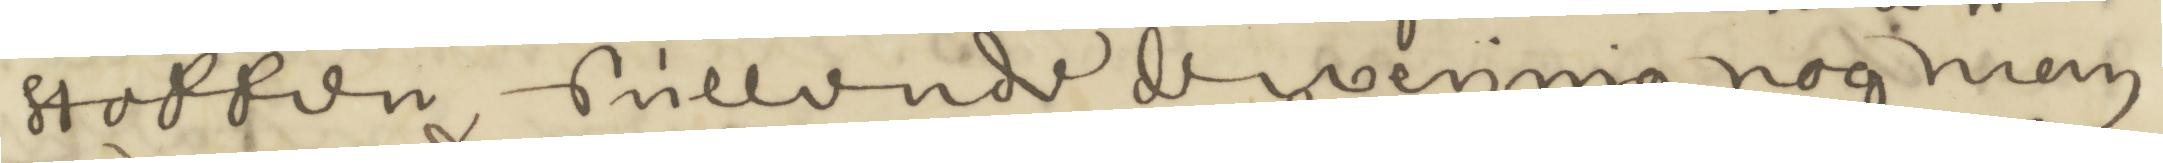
stoffen sullende de weijnig nog man
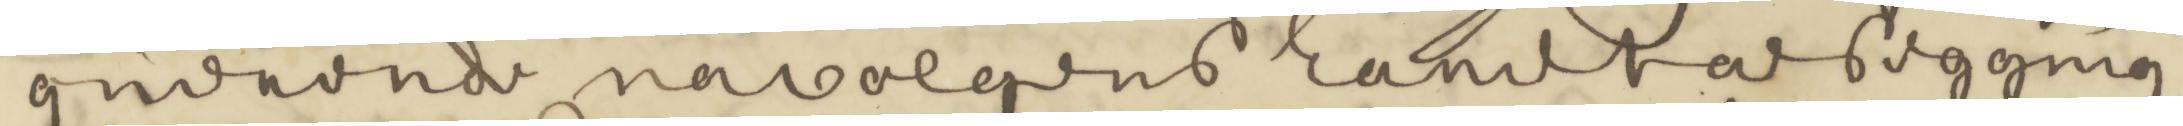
querende navolgens hare toesegging
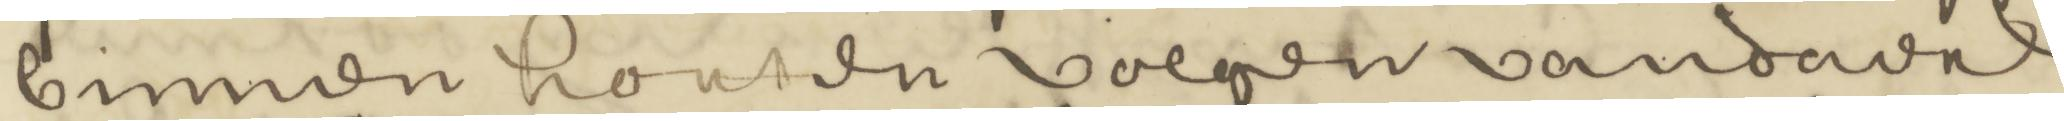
binnen korten volgen vandaer
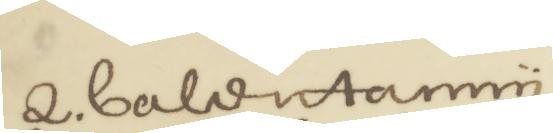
2. balen tannij
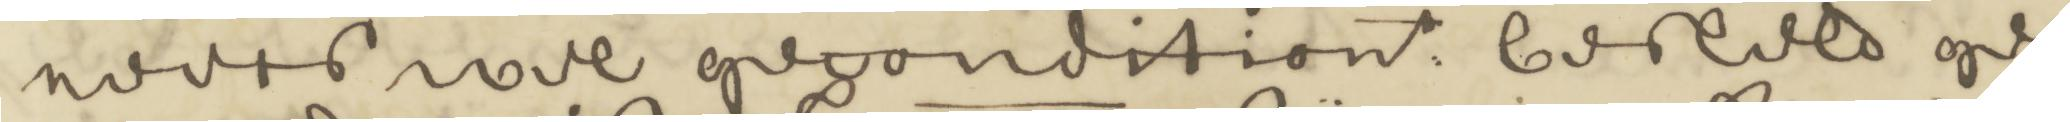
reets wel gecondition:t besteld ge
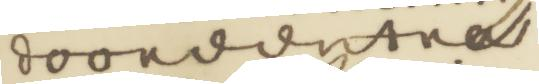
door een tra
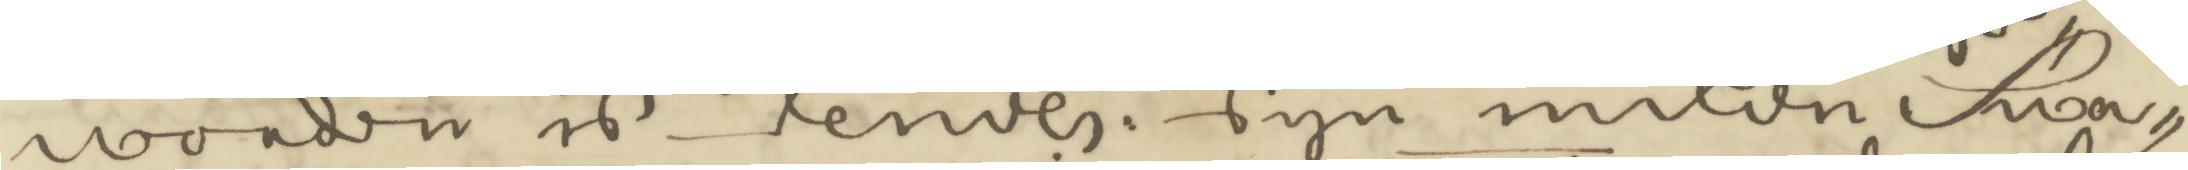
worden is Eenelijk sijn in Een swa„
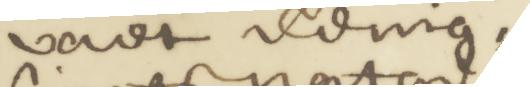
vaet Eenig„
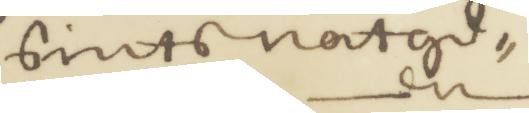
sints nat ge„
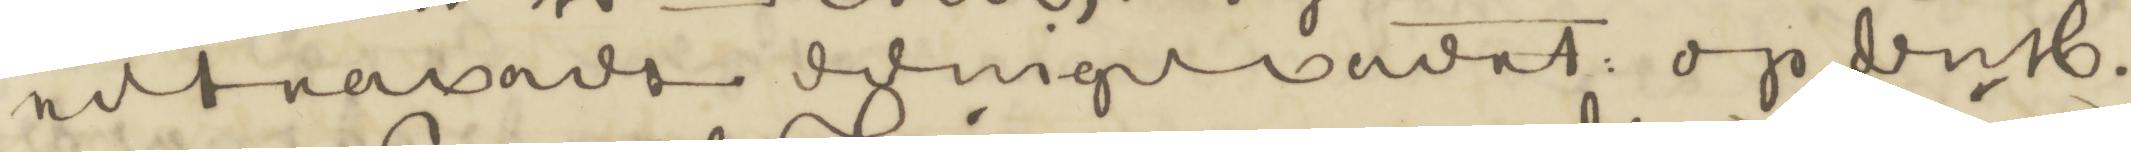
retravaet eenige vaert: op den 16.
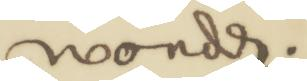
wordenen.
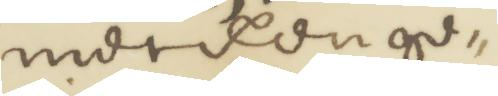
met Een ge„
